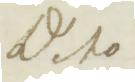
Dito . . . . . . . .
